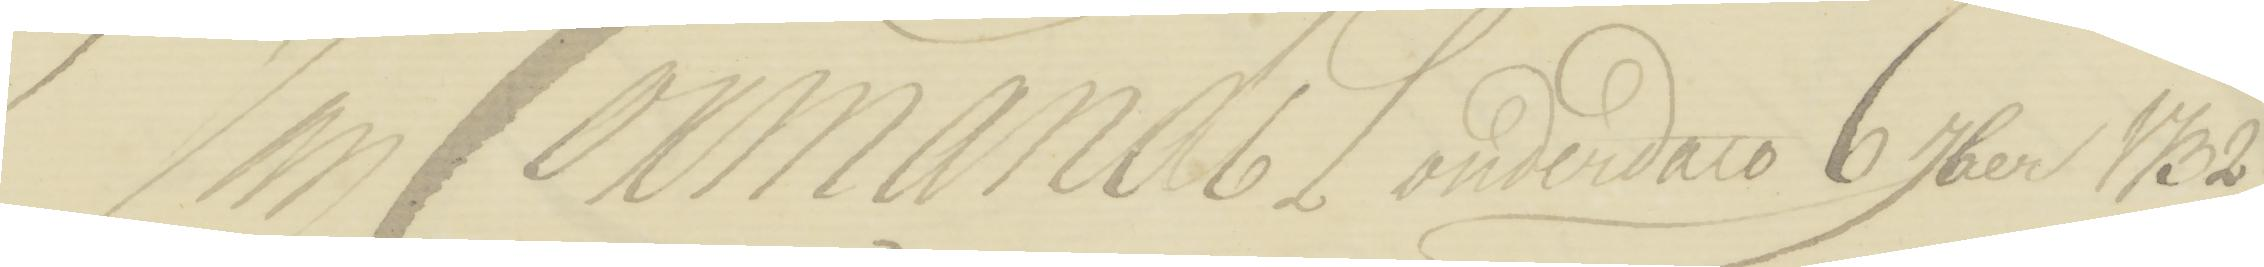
Van Cormandel onderdato 6 7ber 1732
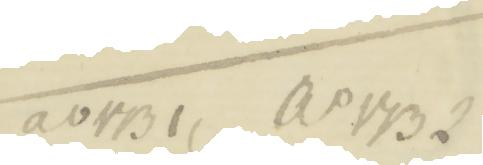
ao 1731 Ao 1732
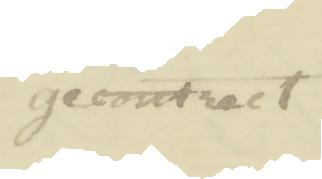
gecontract
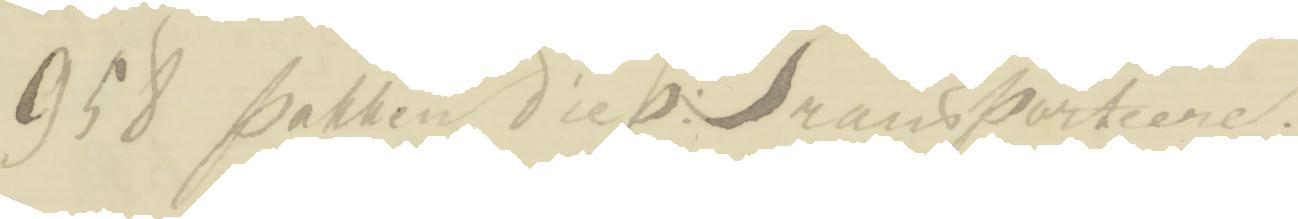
958 pakken die p:r Transporteere.
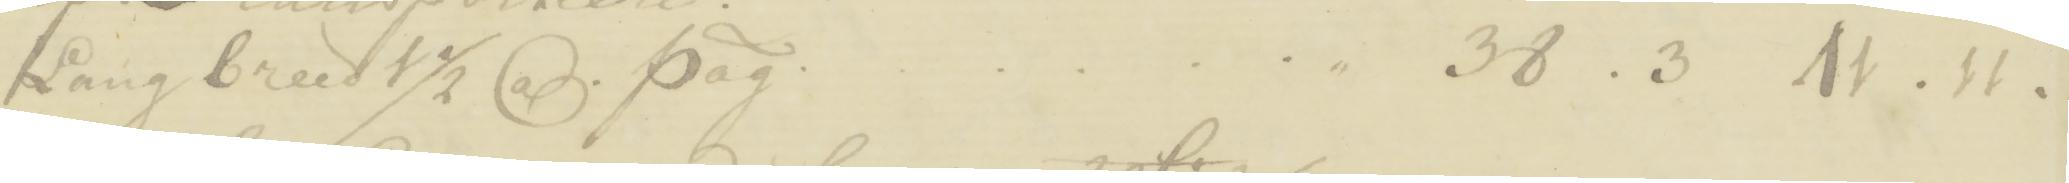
Lang breed 1½ @. pag . . . . . .„ 38 .3 11 .11 .
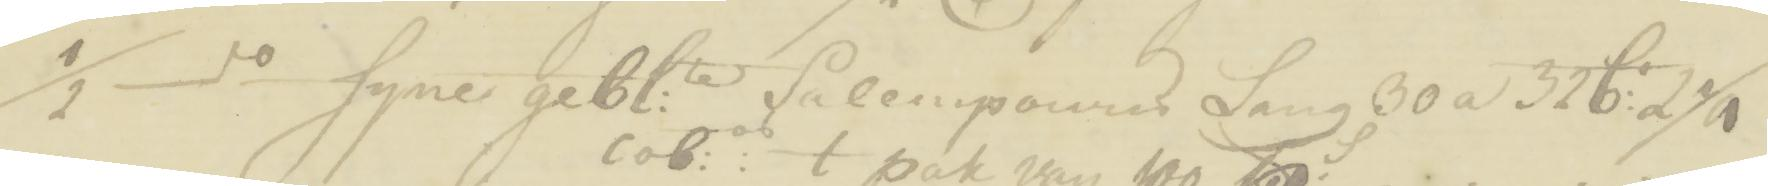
½ _o fyne gebl:te Salempouris Lang 30 a 32 b:t 2¼
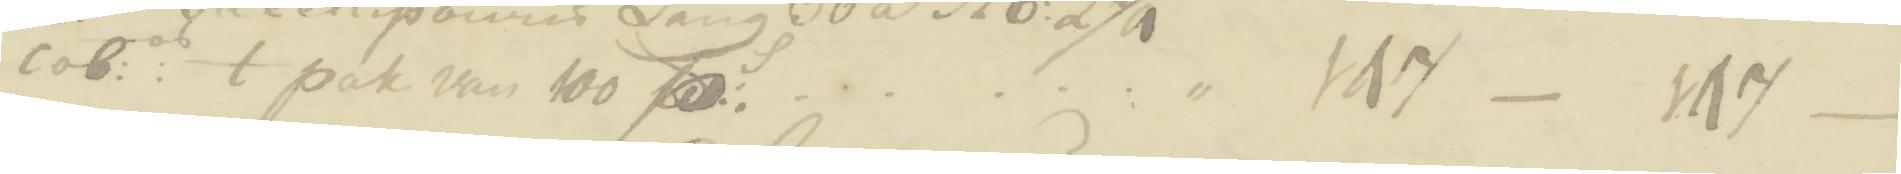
cob:os: t pak van 100 p:s . . . . . „ 147 — 147 —
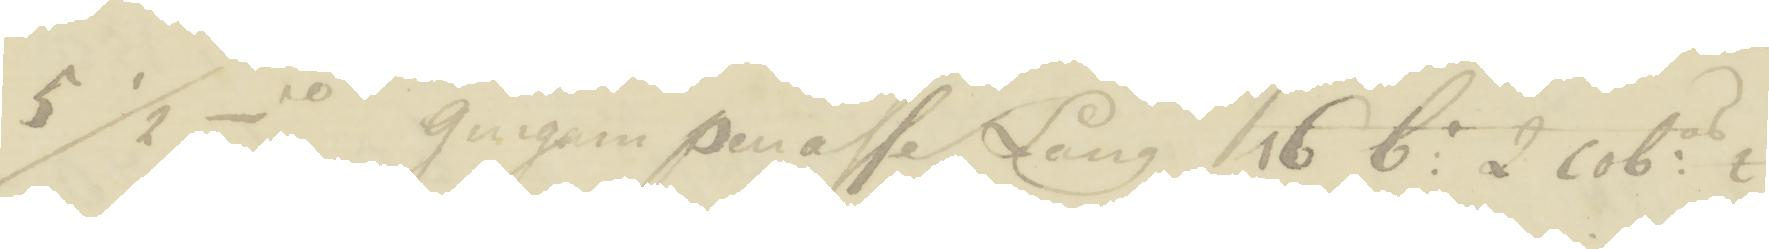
5½ _o gingam penasse Lang 16 b:t 2 cob:os t
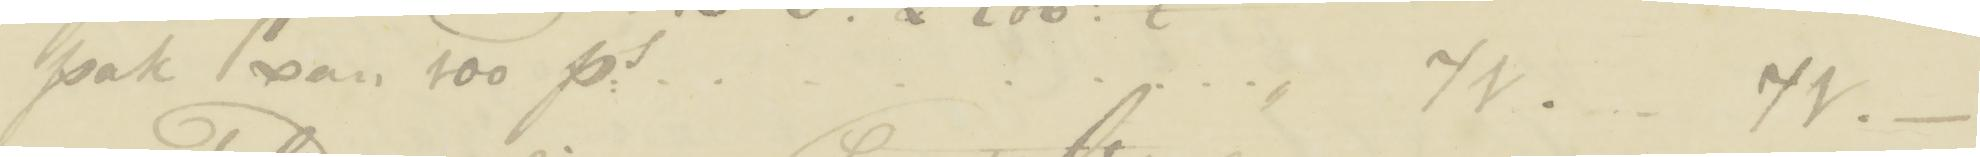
pak van 100 p:s . . . . . . . . . „ 71. 71.—
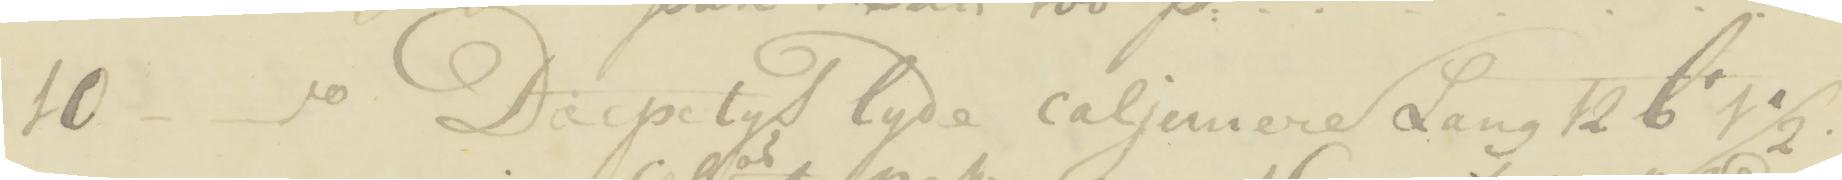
10 _o Doepetys lyde caljemere Lang 12 bt 1½.
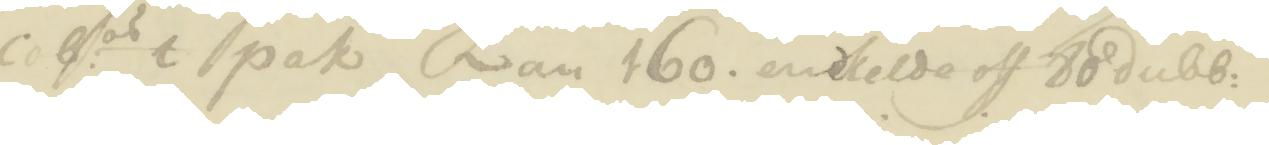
cob:os t pak van 160. enkelde off 80 dubb:
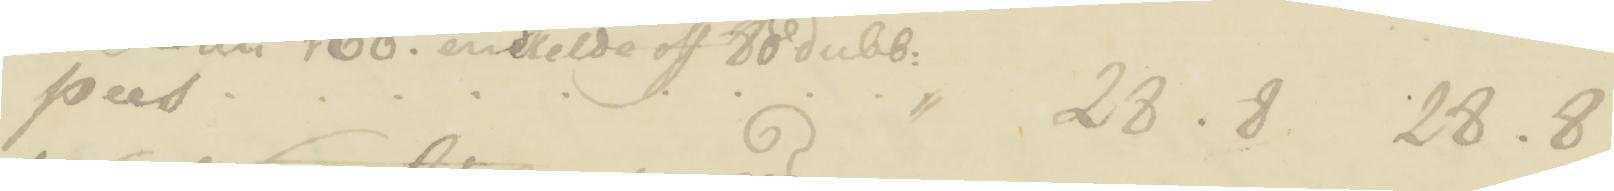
pees. . . . . . . . . „ 28 . 8. 28 .8
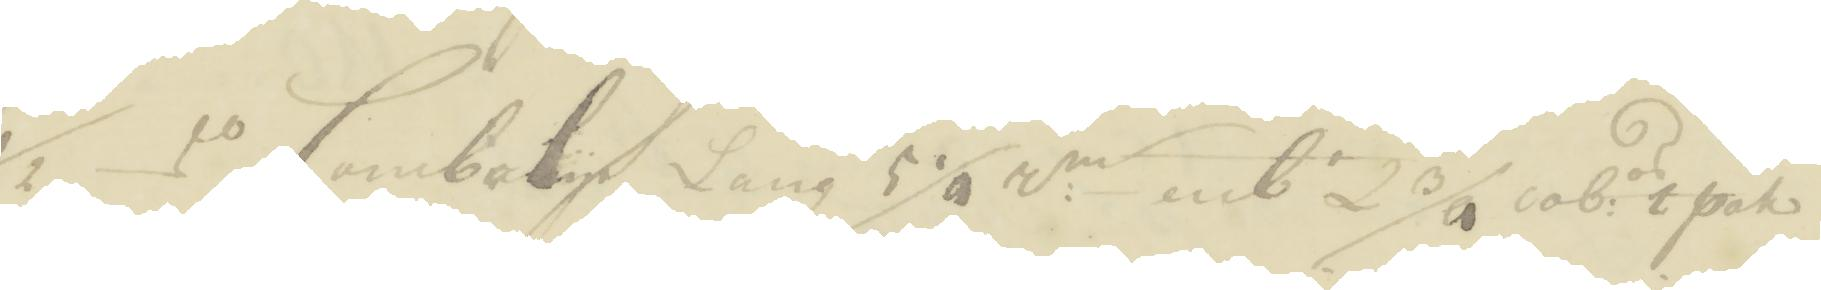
½ _o cambalijs Lang 5¼ r:m en bt 2¾ cob:os t pak
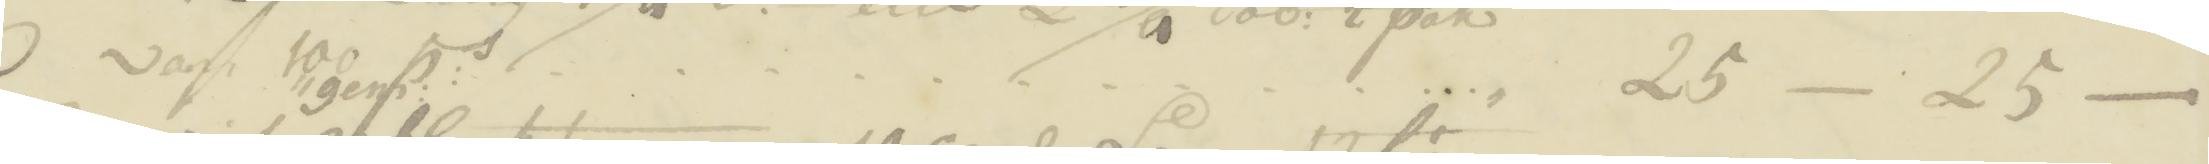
van 100 „gem: p:s . . . . . . . . . . . . . „ 25 — 25 —
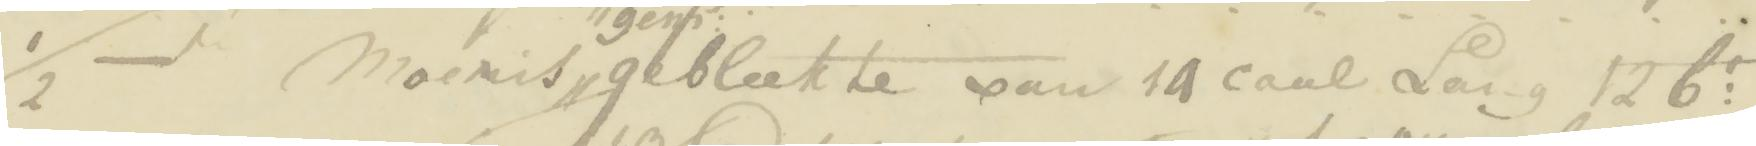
½ _o Moeris „ gebleekte van 14 caul Lang 12 b:t
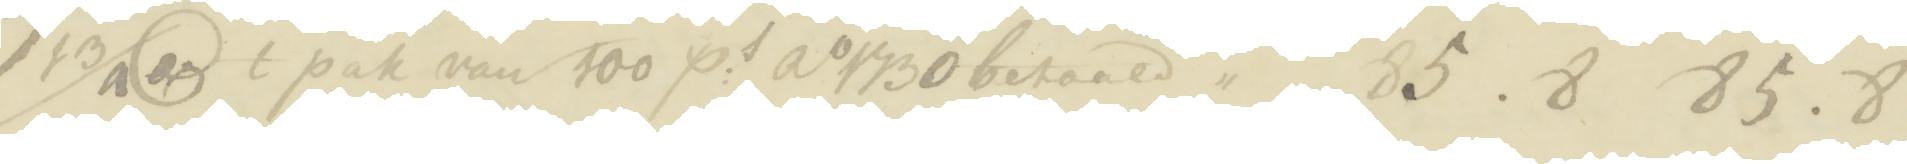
1¾ @ t pak van 100 p:s ao 1730 betaald „ 85 . 8 85 . 8
